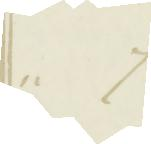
„ 7
